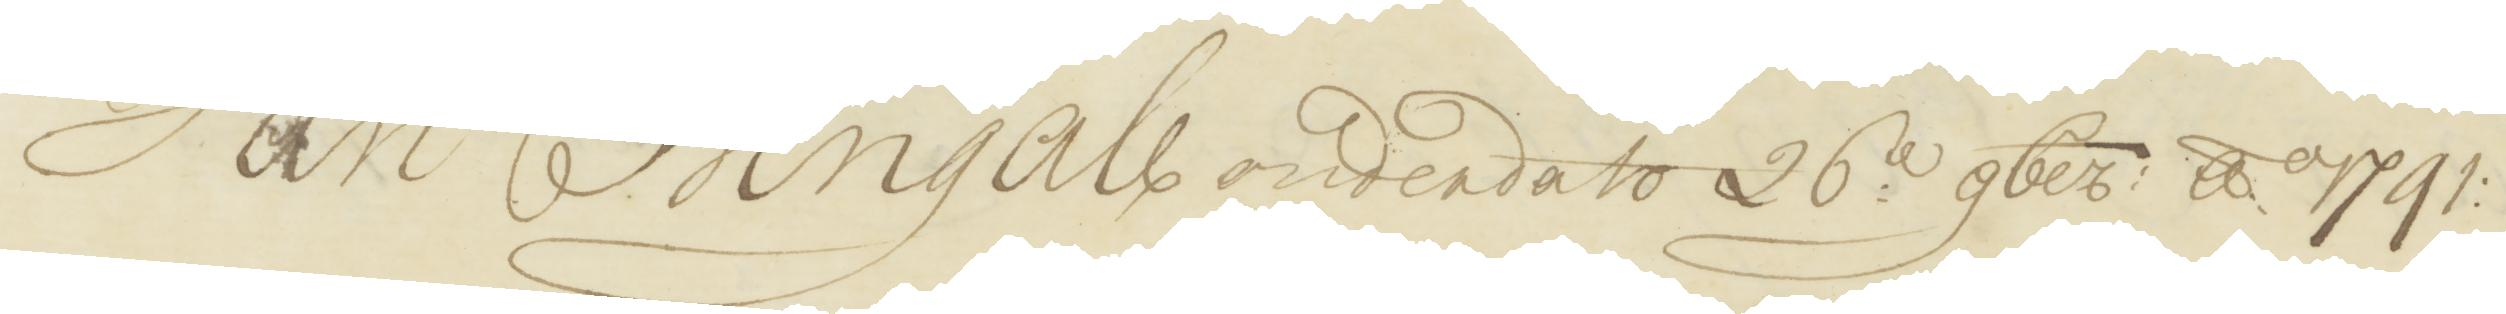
Van Bengale onderdato 26=' 9ber: a:o 1741: —
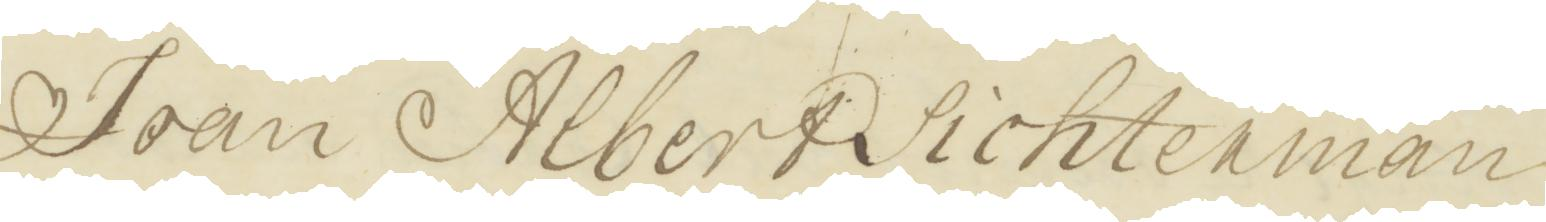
Ioan Albert sichterman
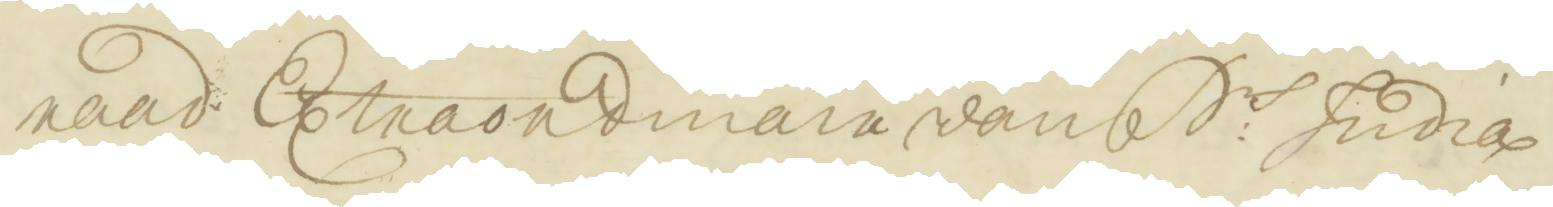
raad Extraordinair van P:s Jndia
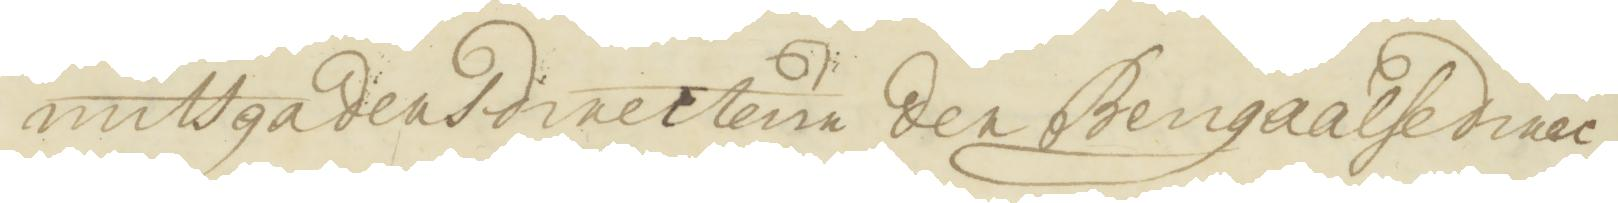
mitsgaders directeur der Bengaalse direc
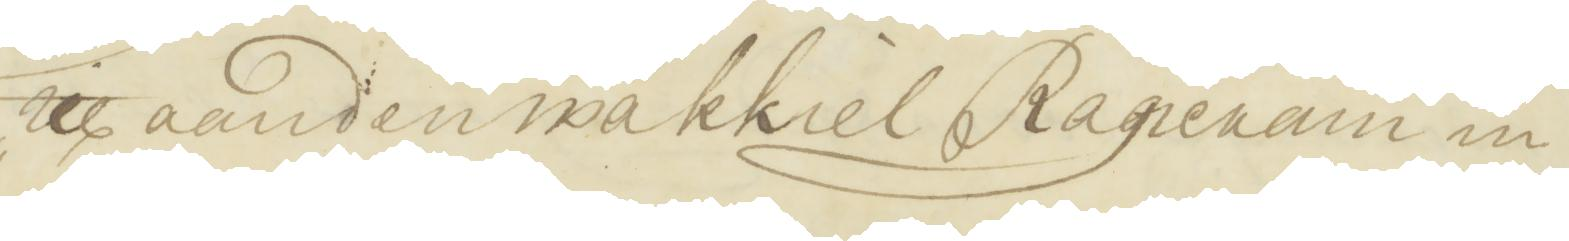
tie aan den wakkiel Ragieram in
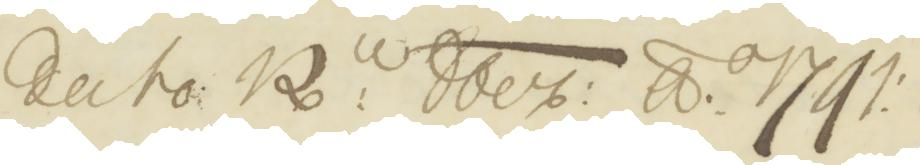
dato: 12:' 8ber: a:o 1741:
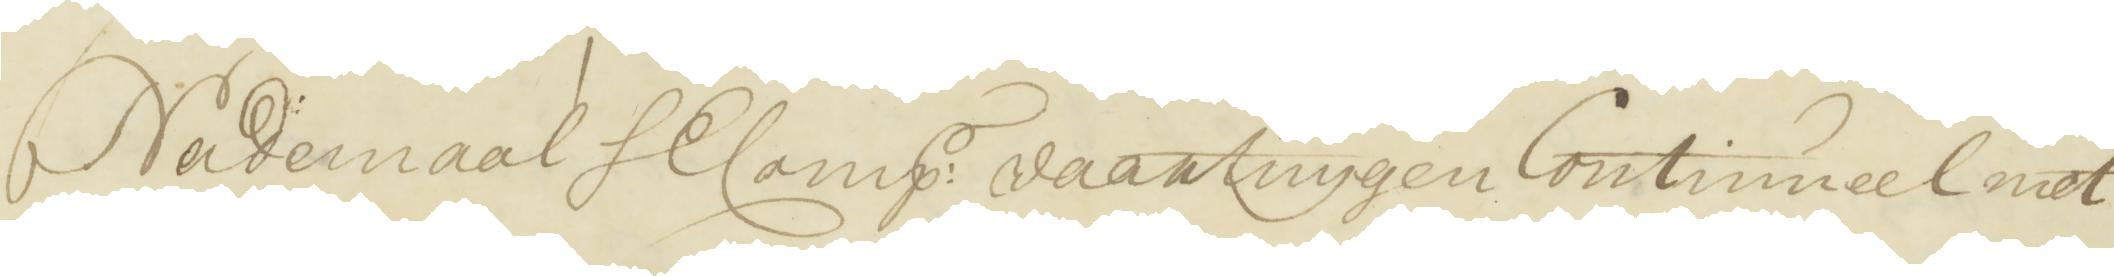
Nademaal 'sEComp:s vaartuijgen continueel met
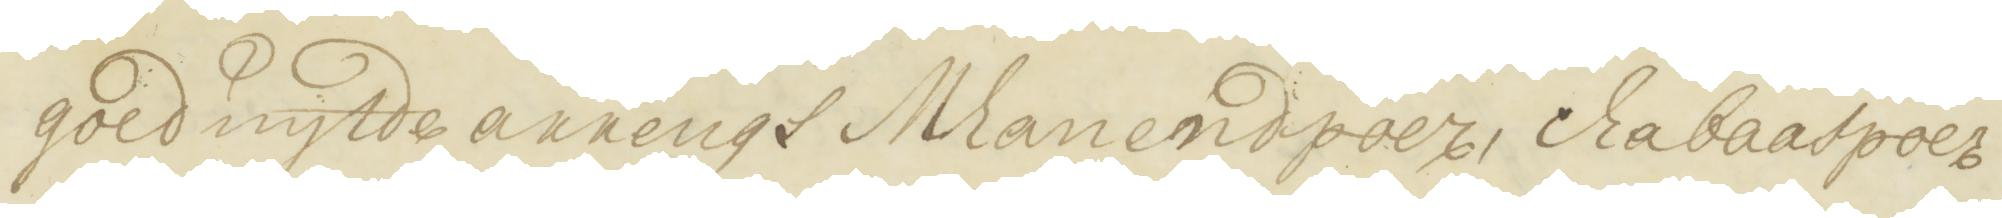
goed uijt de arrengs Mhanendpoer, chabaaspoer
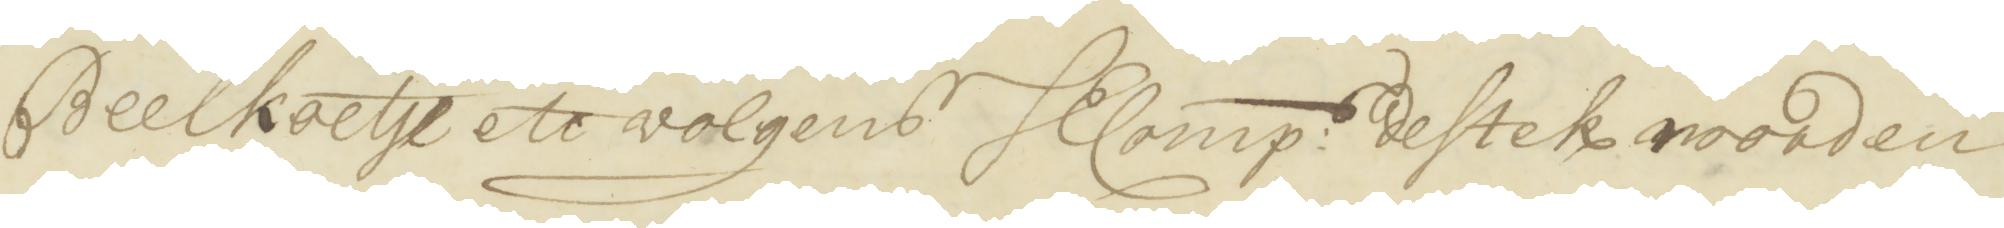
Beelkoetje etc volgens 'sEComp:s bestek worden
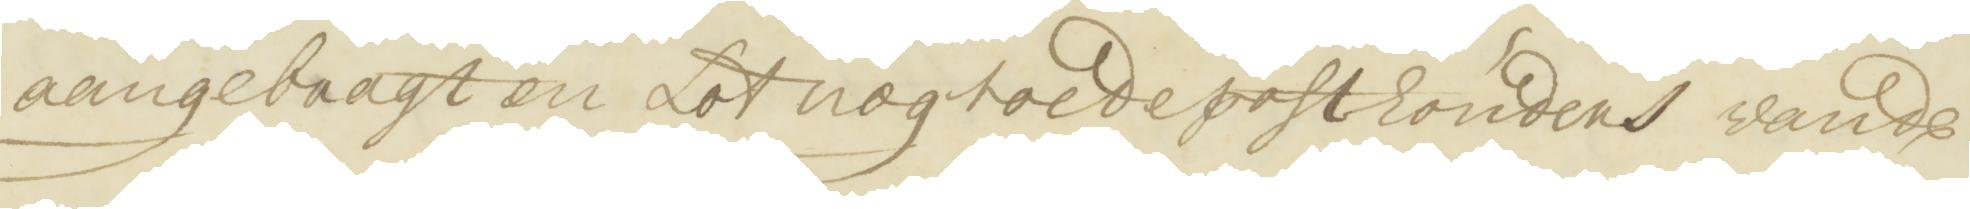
aangebragt en tot nog toe de posthouders van de
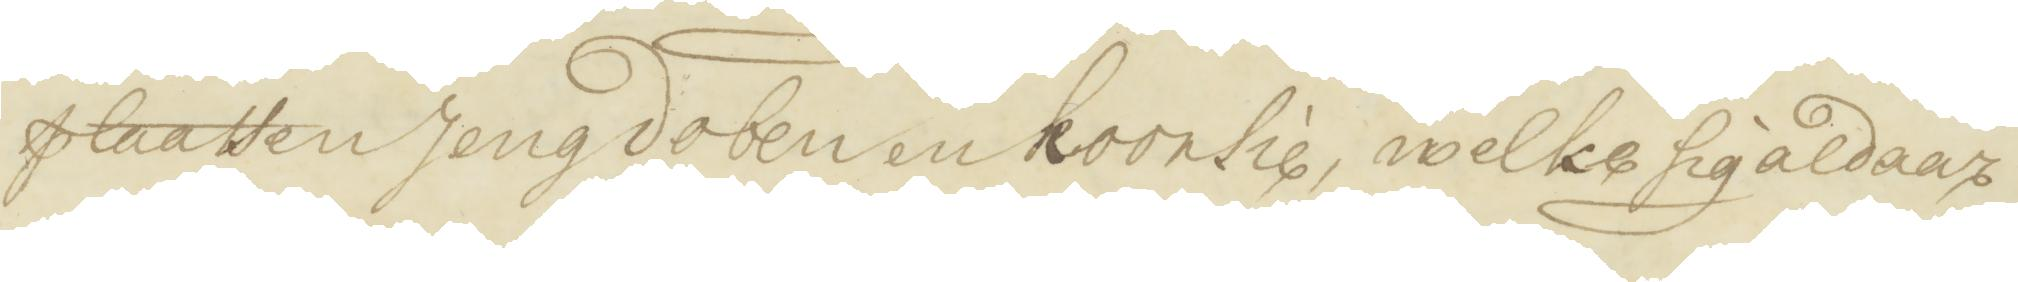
plaatsen Jengdoben en koorsie, welke sig aldaar
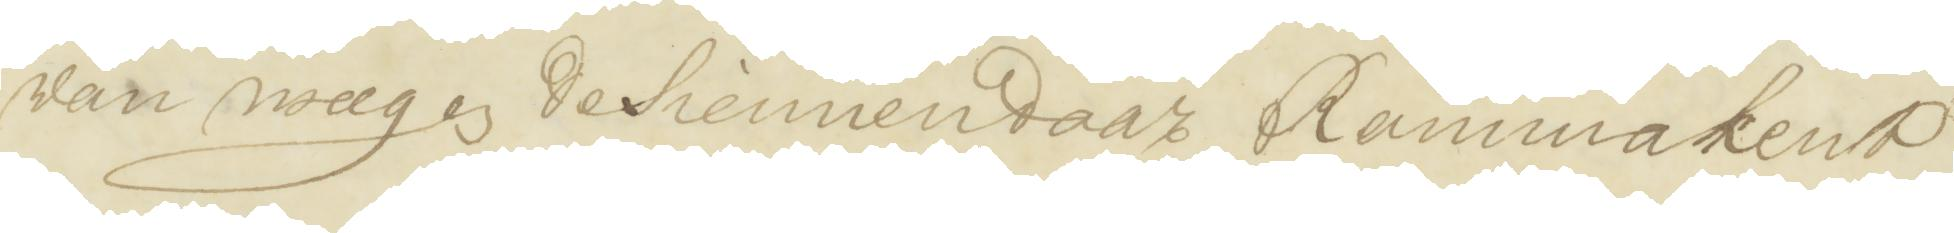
van weegen de siemiendaar Rammakent
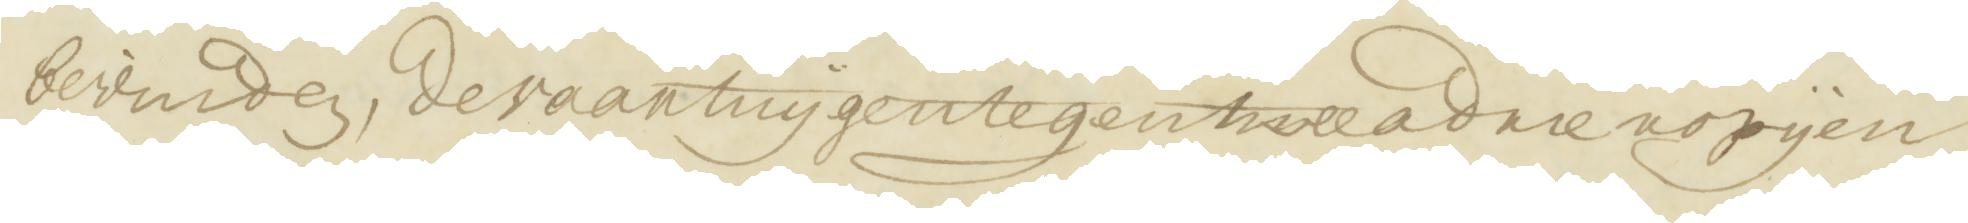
bevinden, de vaartuijgen tegen twee a drie ropijen
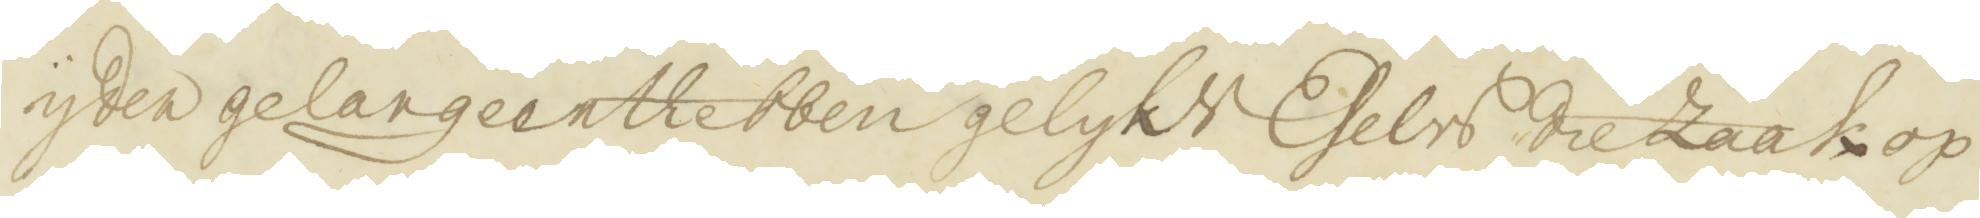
ijder gelargeerthebben gelyk VE selvs die zaak op
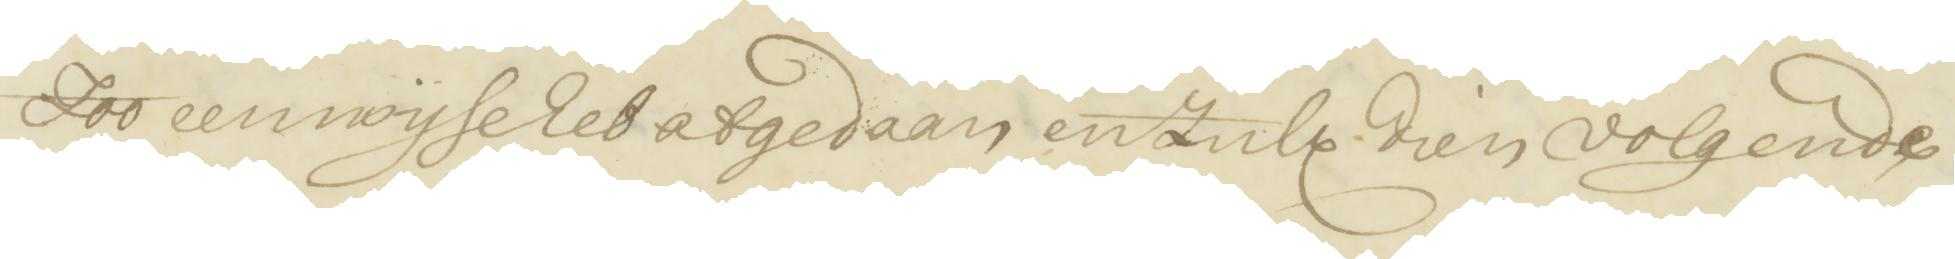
zoo een wijse heb afgedaan en zulx dien volgende
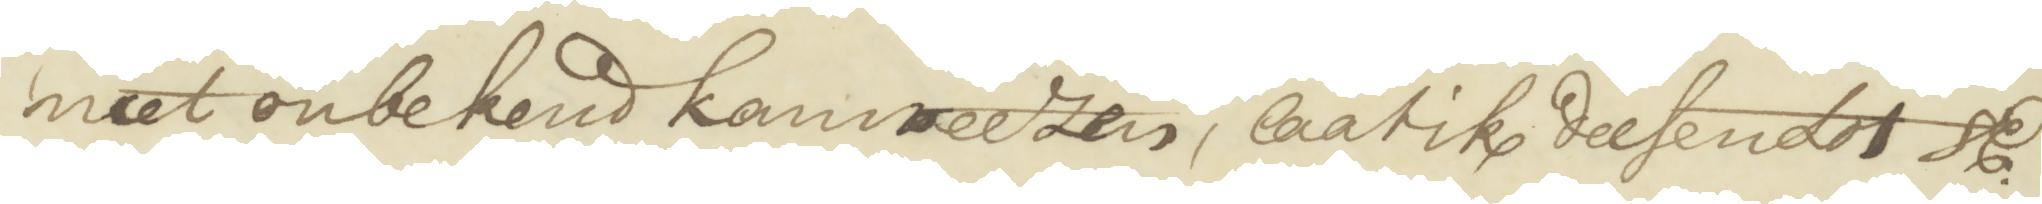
niet onbekend kan weezen, laat ik deesen tot VE
